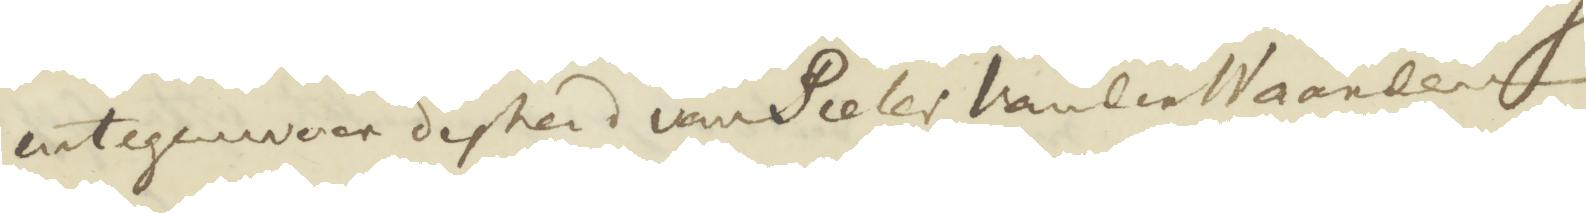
in tegenwoordigheid van Pieter Van der Waarden
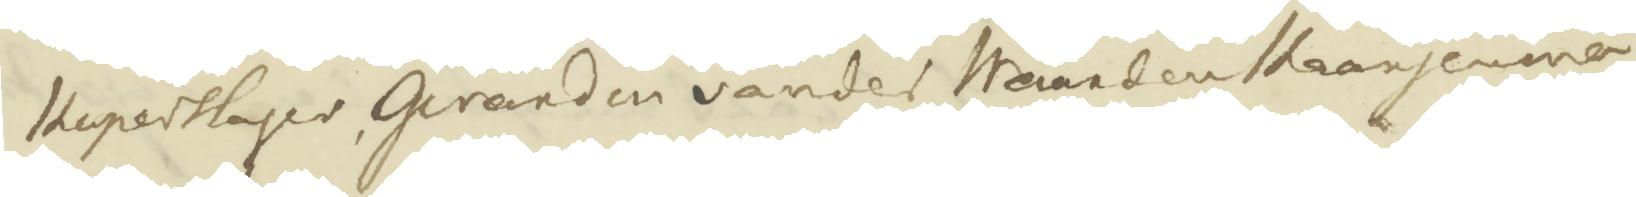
Koperslager, Gerardus vander Waarden Kaarsenma
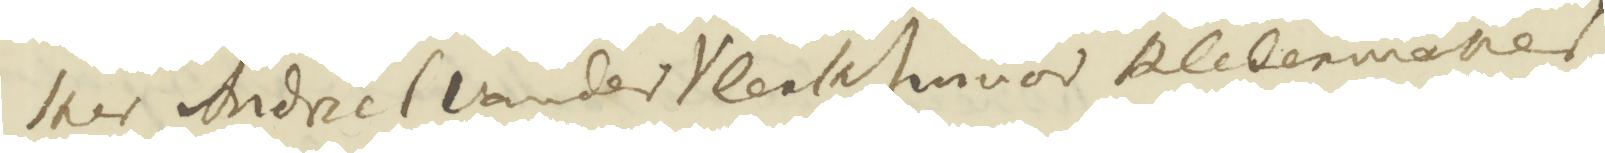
ker, Andries vander Vlerk Junior kledermaker,
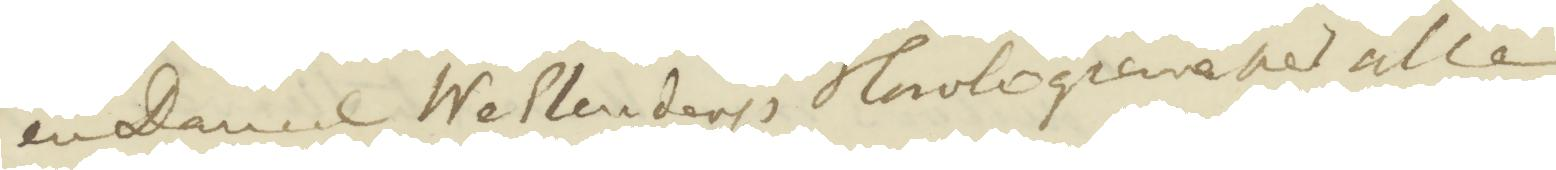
en Daniel Westendorp, Horologiemaker, alle
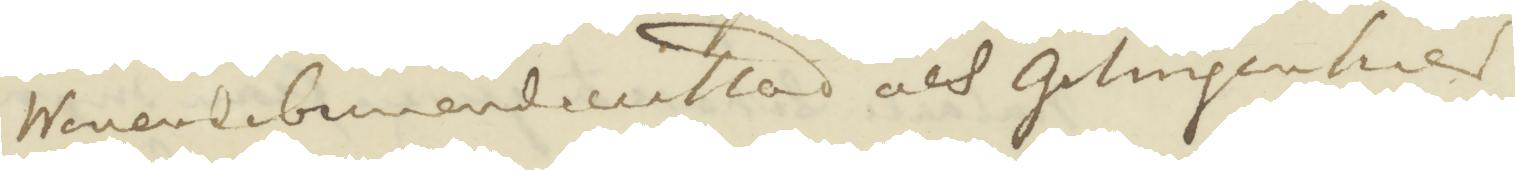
Wonende binne deese Stad als getuigen hier
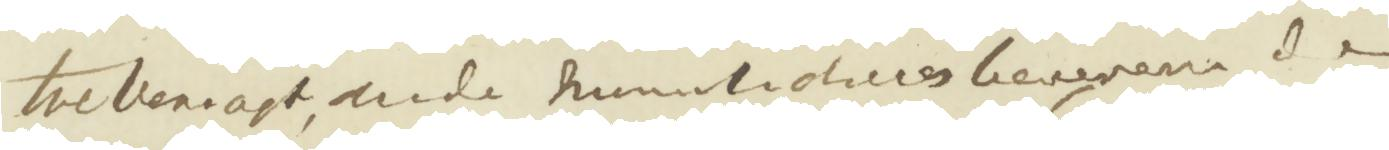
toe versogt, ende minute deeses benevens de
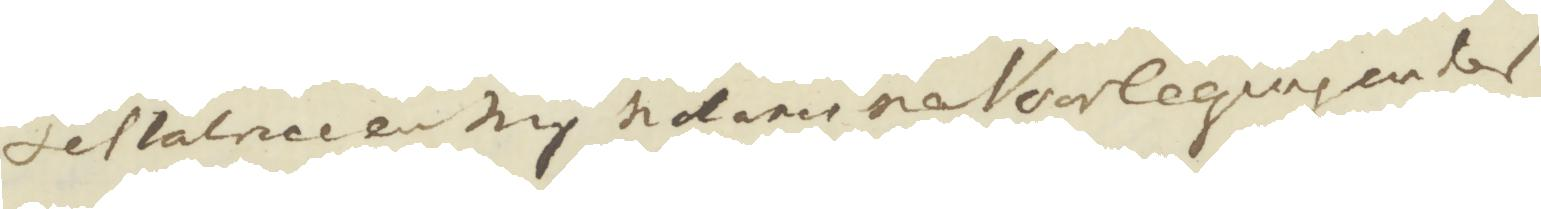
Testatrice en my notaris na Voorleging onder
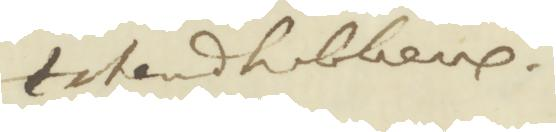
tekend hebben.
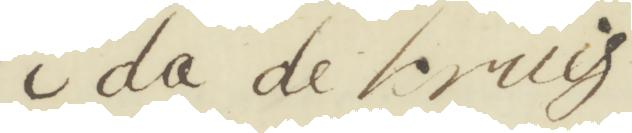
ida de kruis
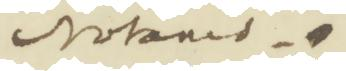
Notaris -.
